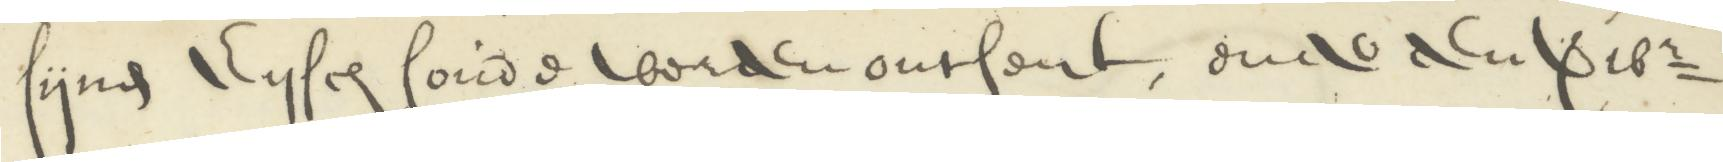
sijnen Eysch soude werden ontsent, ende den verw=r
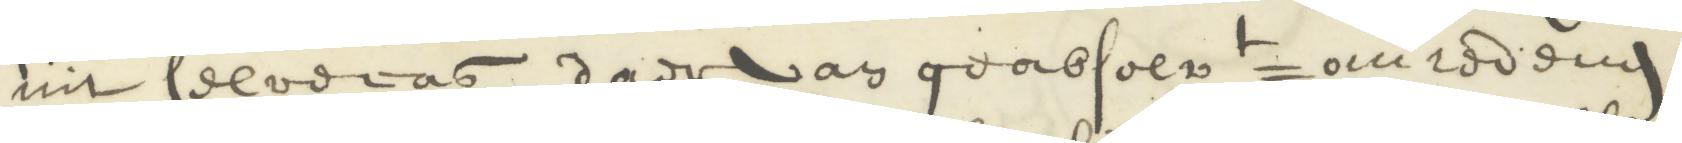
int selvecas daervan geabsolv=t om redenen
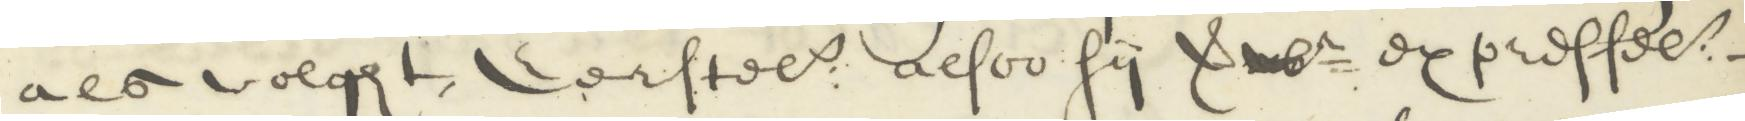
als volght, Eerstelijk alsoo sij verw=r expresselijk —
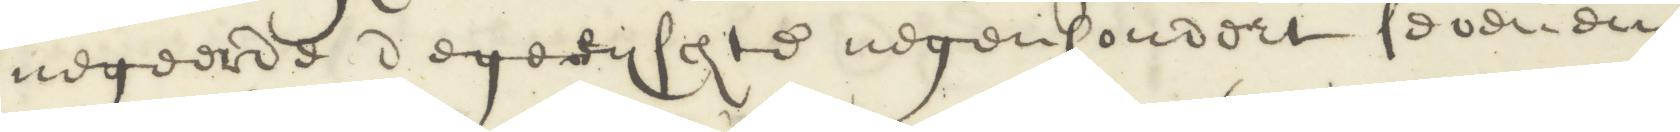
negeerde degeeijschte negenhondert seven en
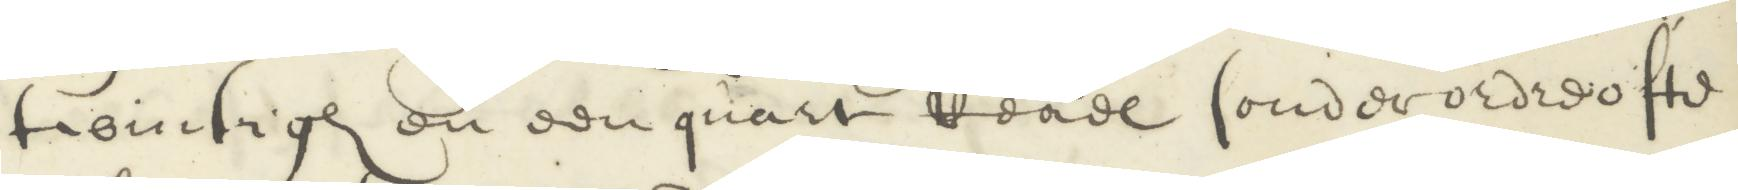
twintigh en een quart Reael sonder ordre ofte
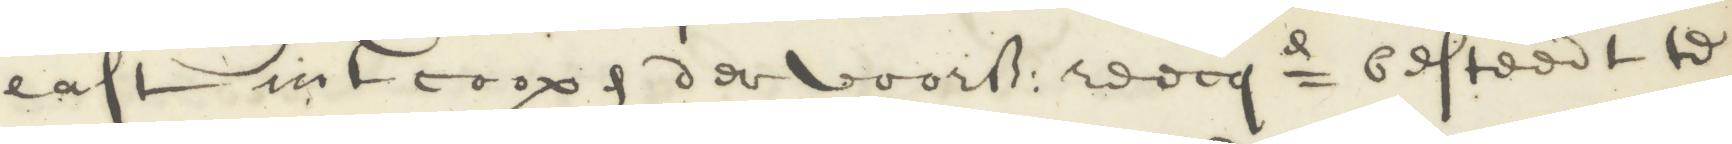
last in t coopen der voors: reecq=en besteedt te
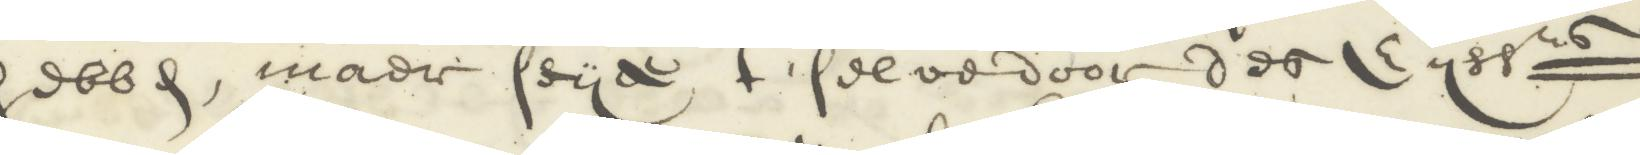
hebben, maer seijde, t' selve door des Eyss=rs
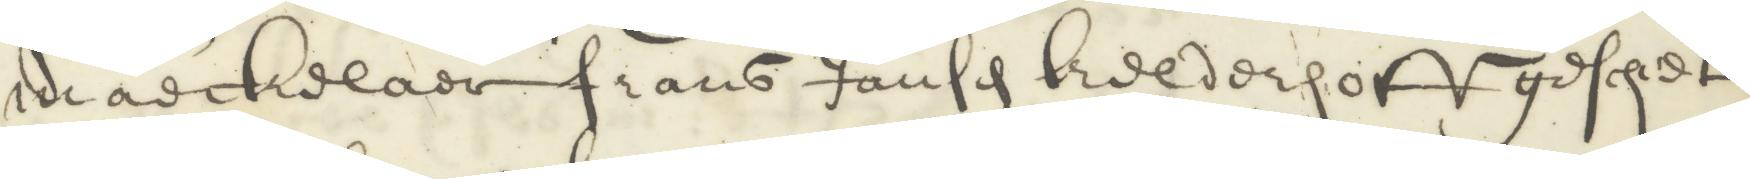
maeckelaer frans Iansen kelderhoff geschiet
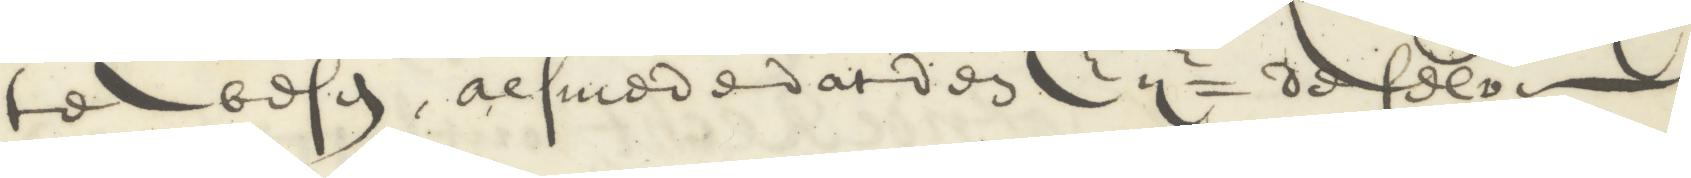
te wesen, alsmededatden Ey=r deselve
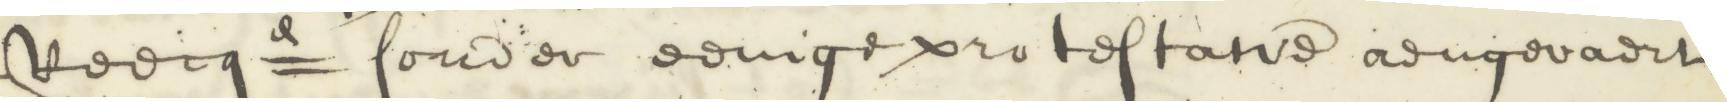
Reecq=en sonder eenige protestatie aengevaert
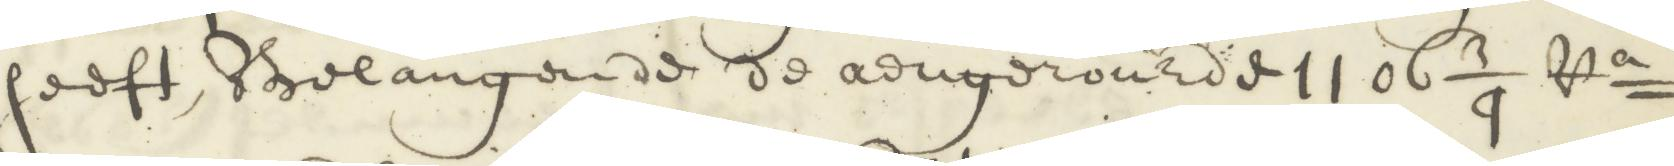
heeft, Belangende de aengerourde 1106 ¾ R=a
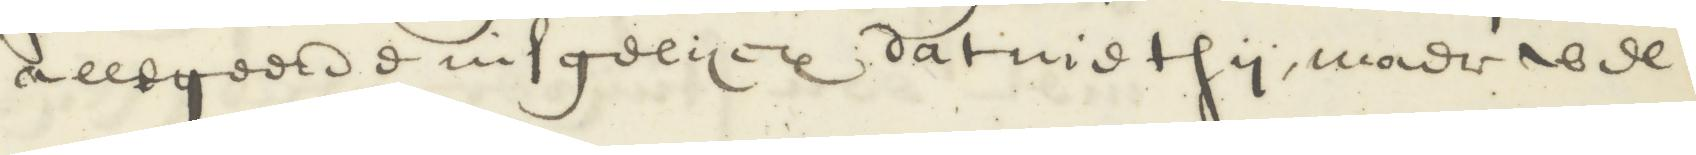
allegeerde insgelijcx datniethij, maer wel
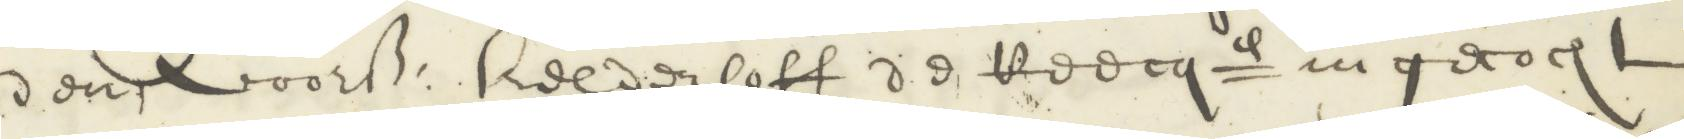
den voors: kelderhoff de Reecq=en in gecocht
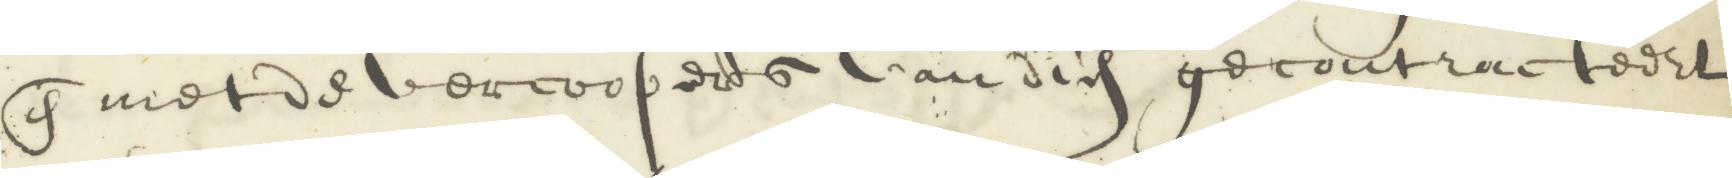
ende met de vercoopers van dien gecontracteert
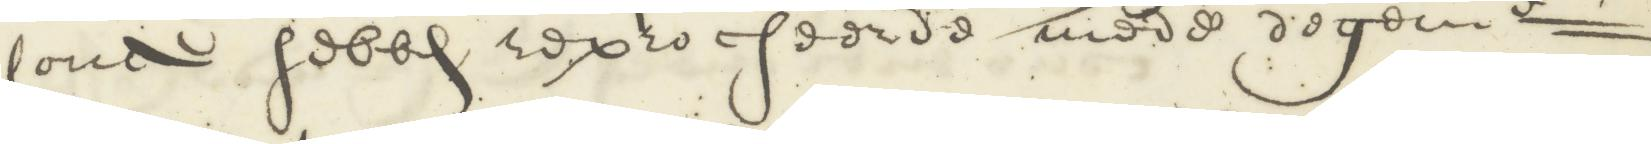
soude hebben reprocheerde mede de gem=e
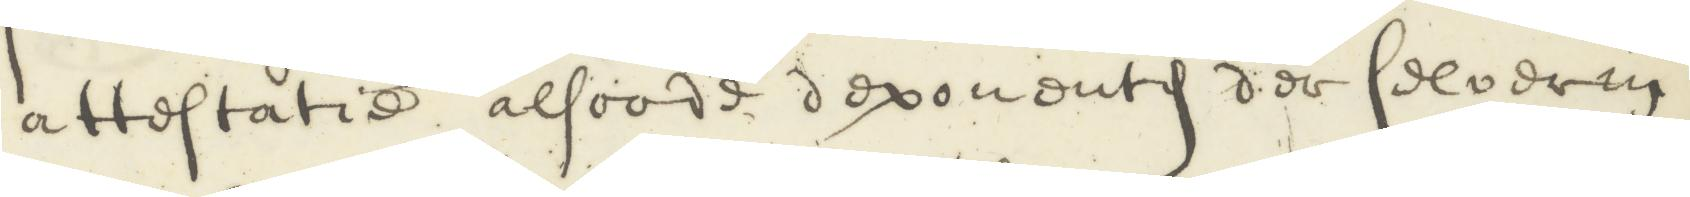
attestatie alsoode deponenten der selver in
